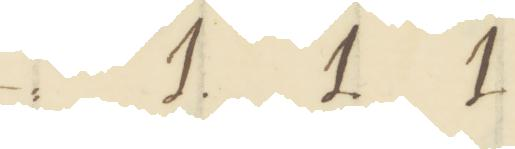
1. 1. 1
